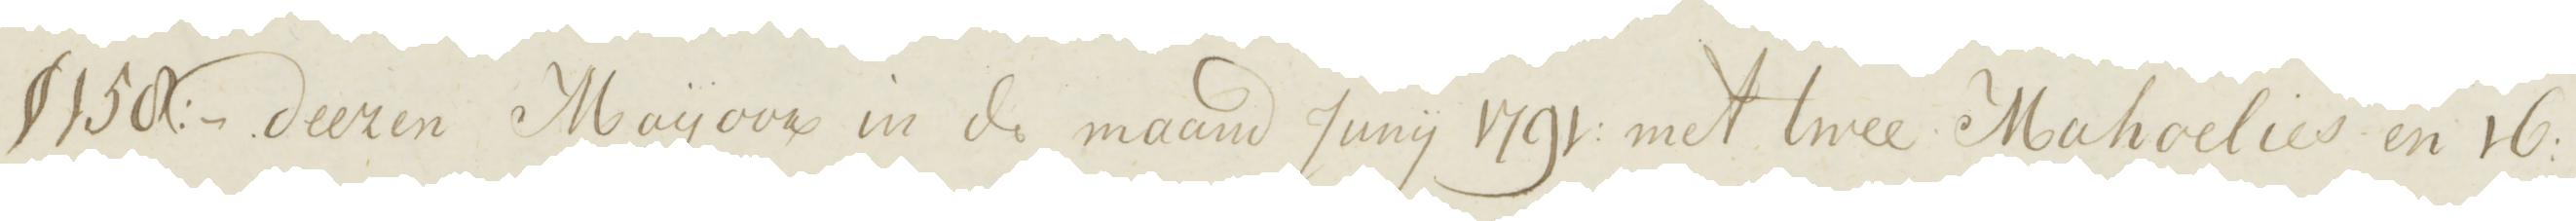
§158:- deezen Maijoor in de maand Junij 1791: met twee Mahoelies en 16:
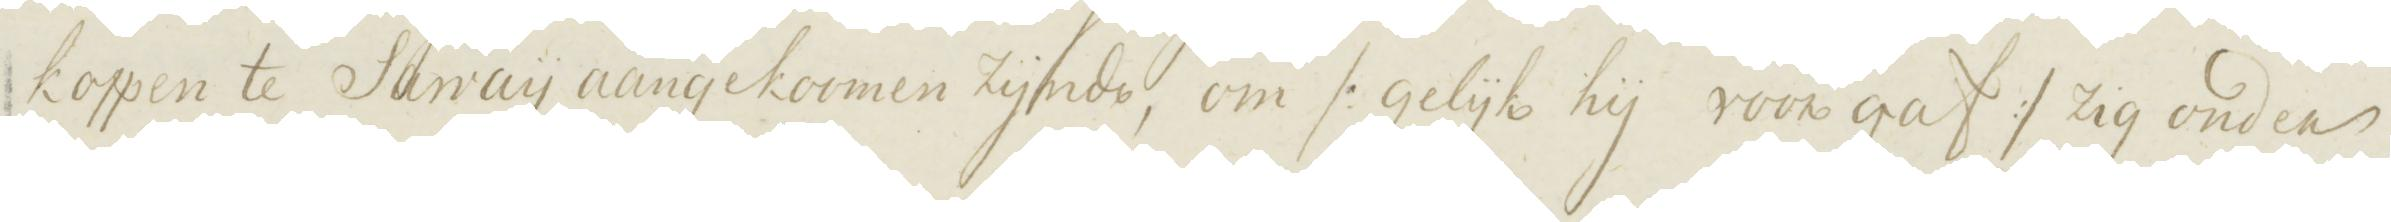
koppen te Sawaij aangekoomen zijnde, om /: gelijk hij voor gaf:/ zig onder
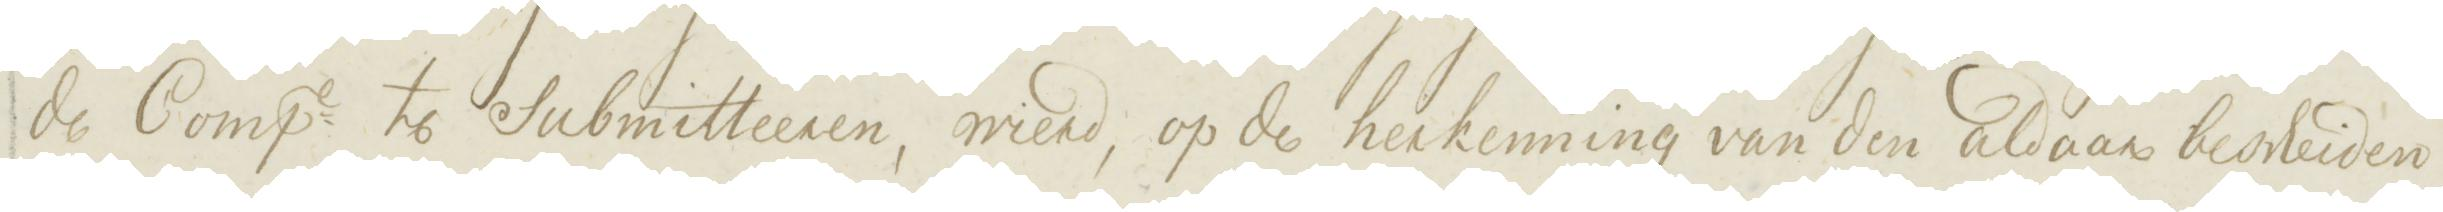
de Comp:e te submitteeren, wierd, op de herkenning van den aldaar bescheiden
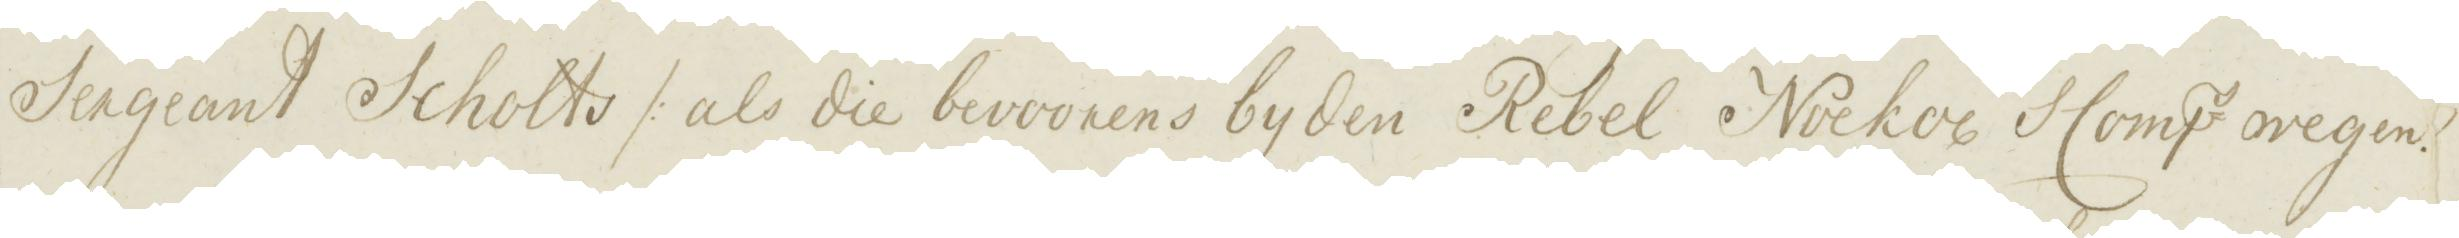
Sergeant Scholts /: als die bevoorens by den Rebel Noekoe sComp:s wegen.
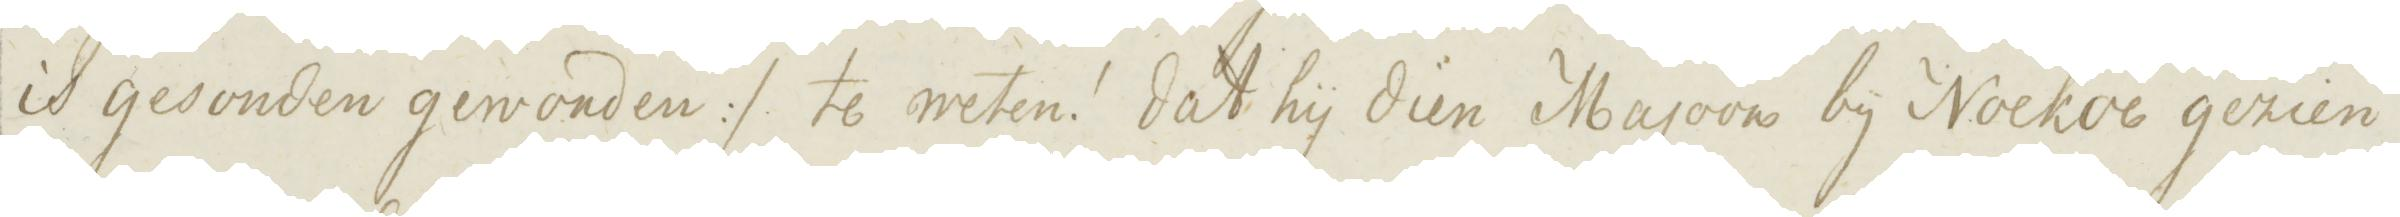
is gesonden geworden:/ te weten! dat hij dien Majoor bij Noekoe gezien
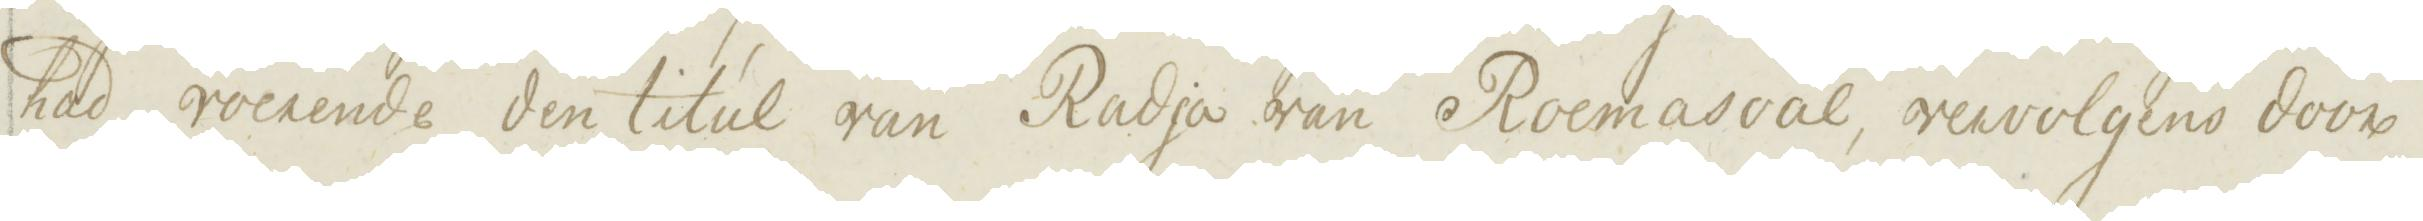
had voerende den titul van Radja van Roemasoal, vervolgens door
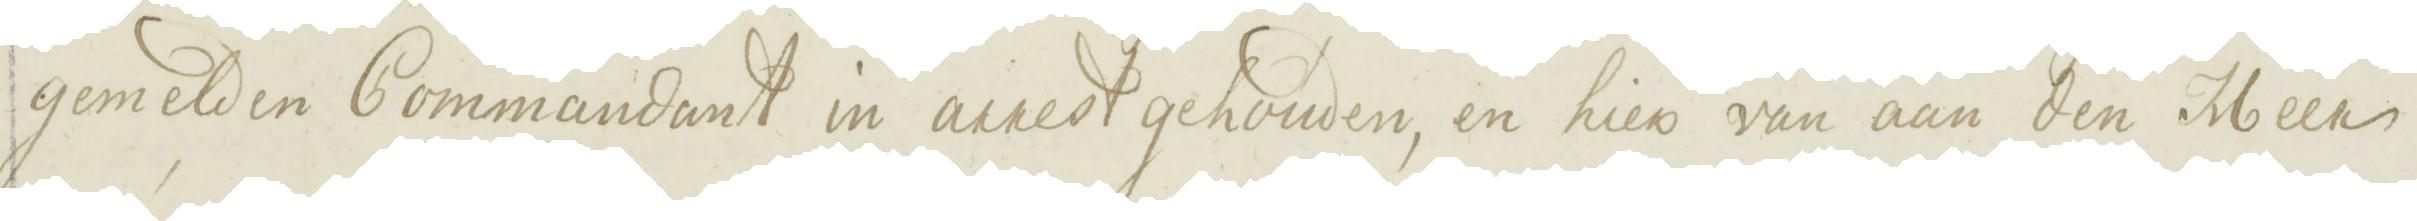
gemelden Commandant in arrest gehouden, en hier van aan den Heer
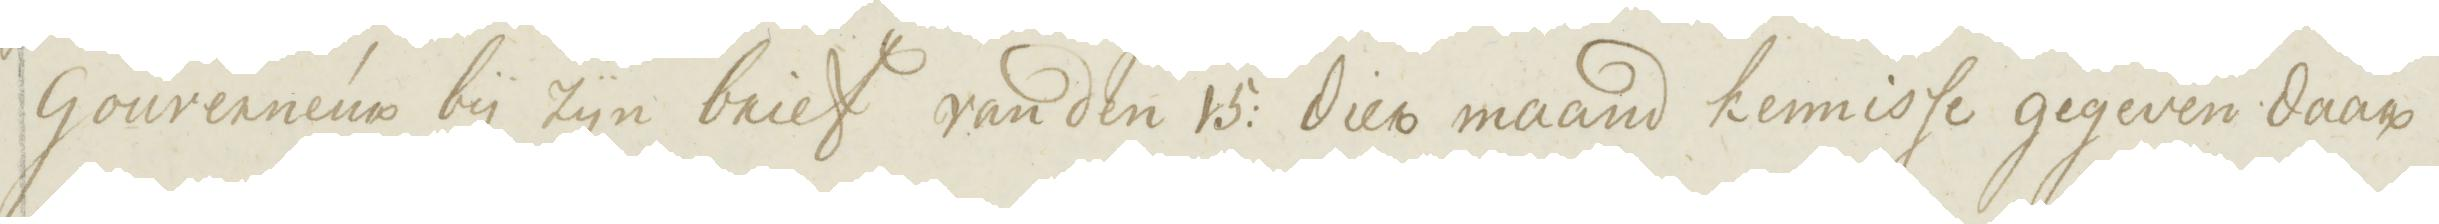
Gouverneur bij zijn brief van den 15: dier maand kennisse gegeven daar
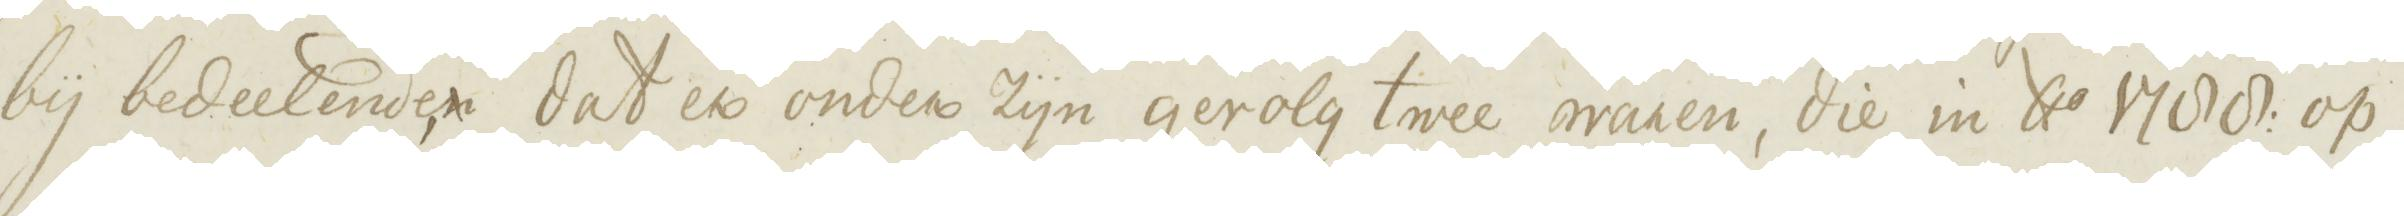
bij bedeelenden dat er onder zijn gevolg twee waren, die in Ao 1788: op
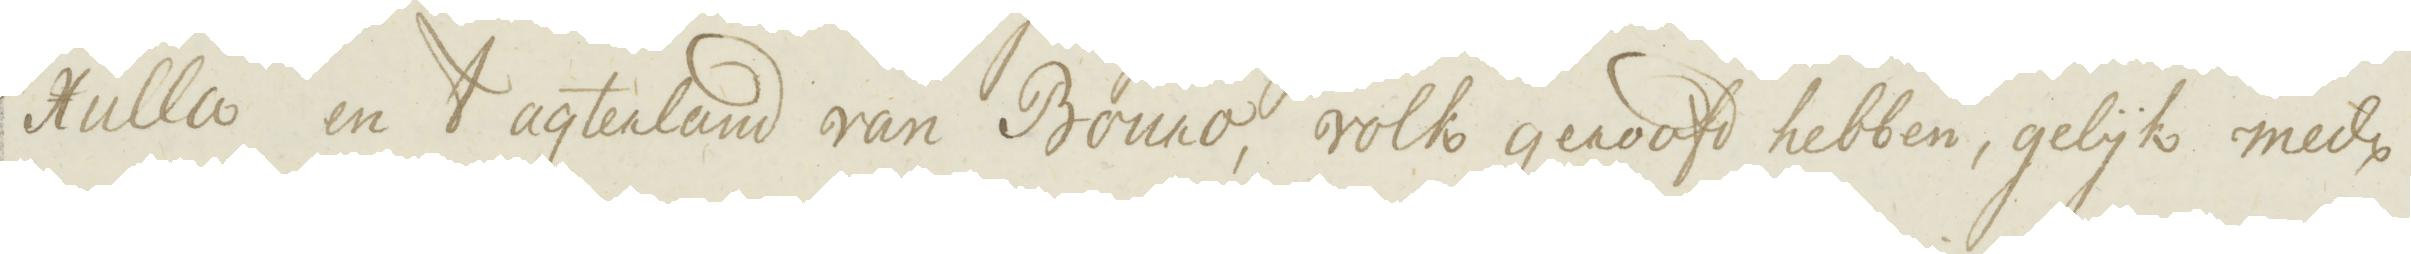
Xulla en 't agterland van Bouro, volk geroofd hebben, gelijk med
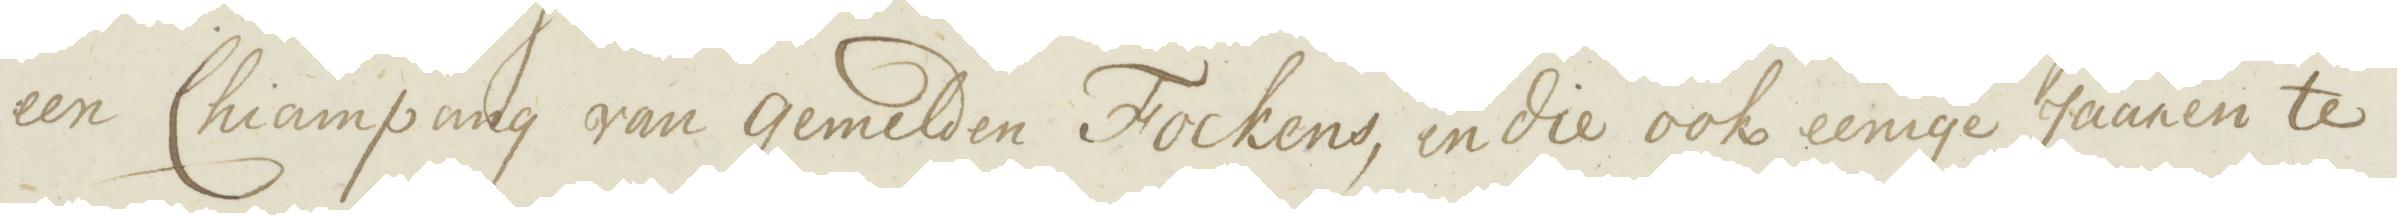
een Chiampang van gemelden Fockens, en die ook eenige Jaaren te
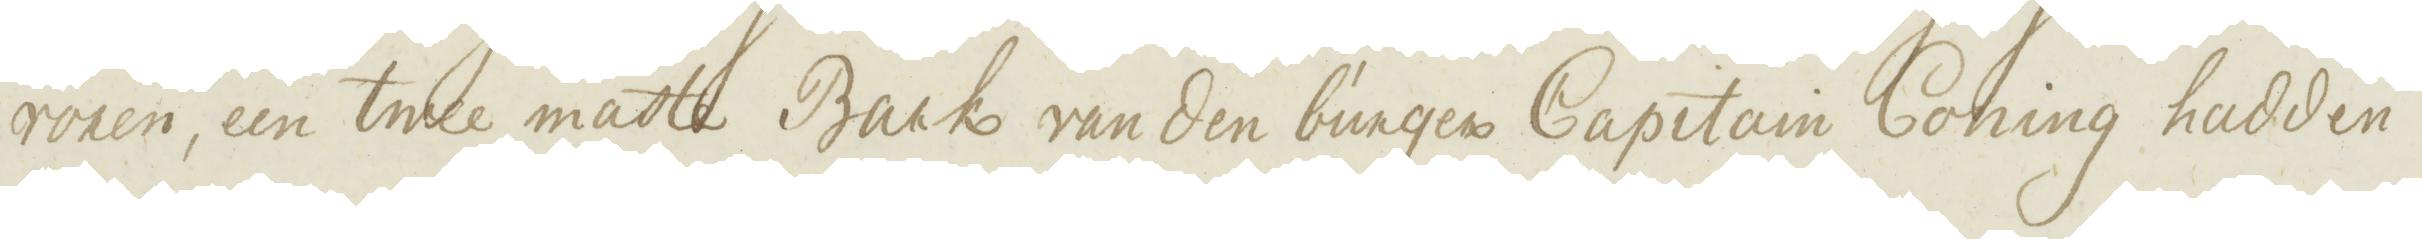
voren, een twee maste Bark van den burger Capitain Coning hadden
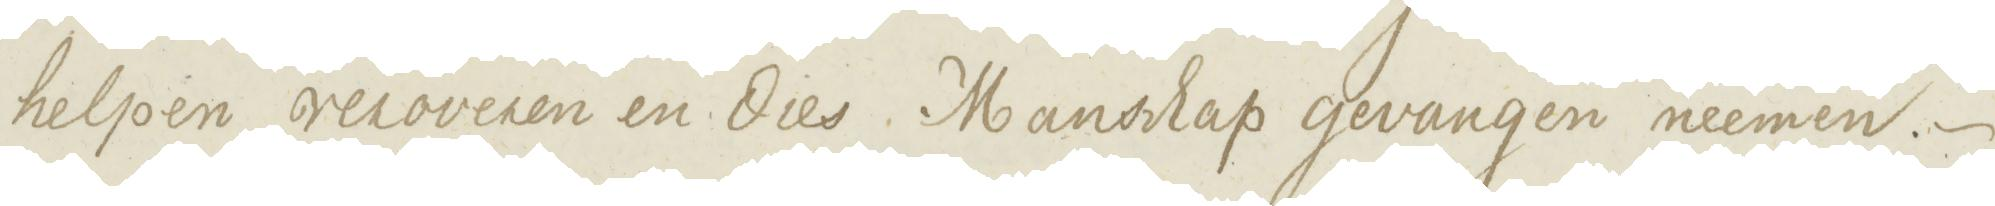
helpen veroveren en dies Manschap gevangen neemen.—
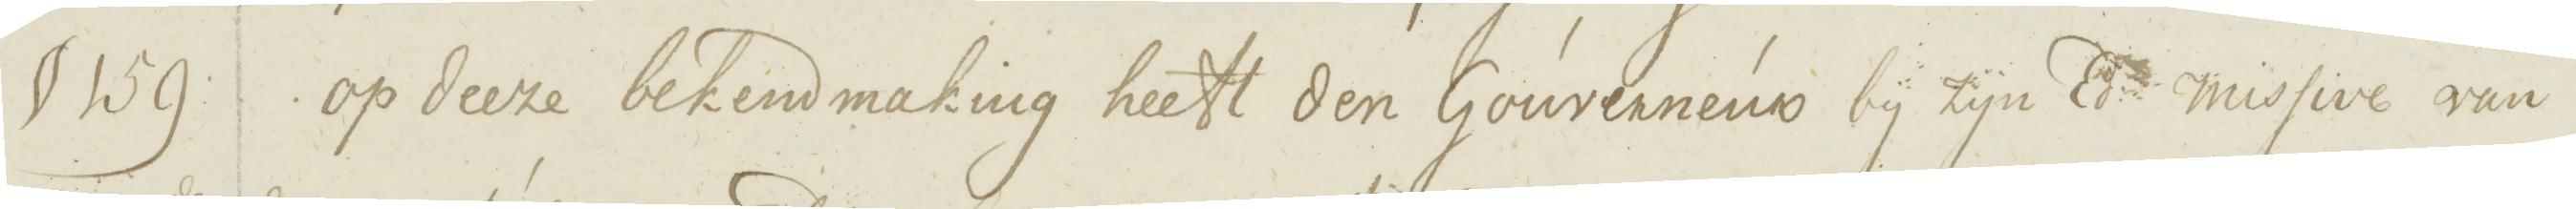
§159: op deeze bekendmaking heeft den Gouverneur bij zijn Ed: missive van
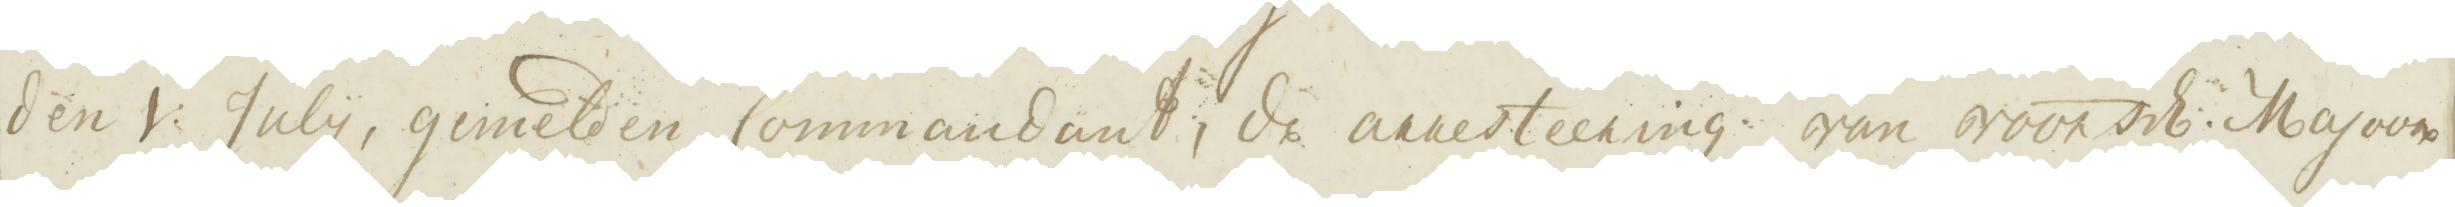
den 1: Julij, gemelden commandant, de arresteering van voorsch: Majoor
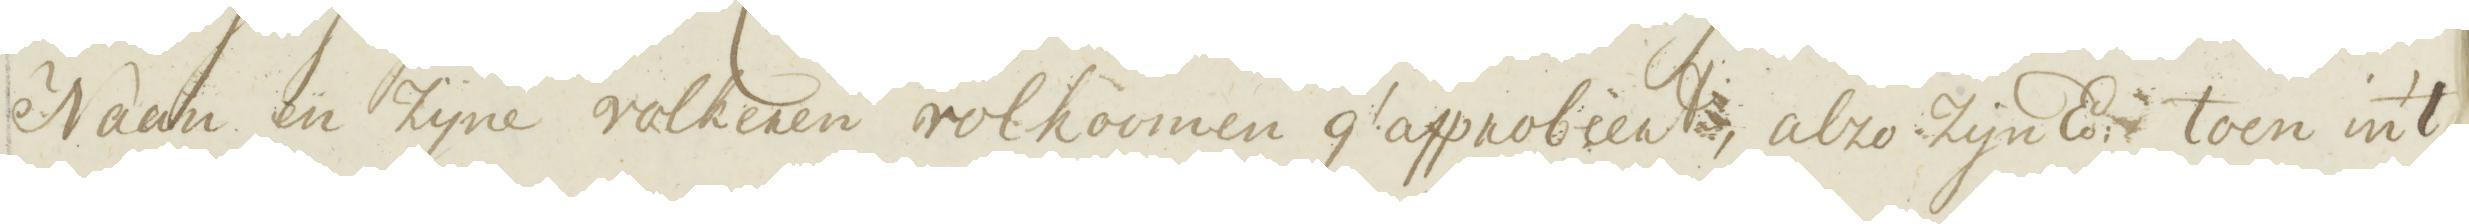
Naan in zijne volkeren volkoomen g’approbeert, alzo zijn Ed: toen in’t
